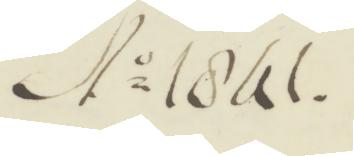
N=o 1841.
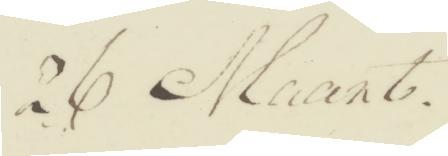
26 Maart.
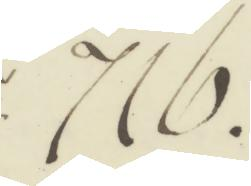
N=o 716.
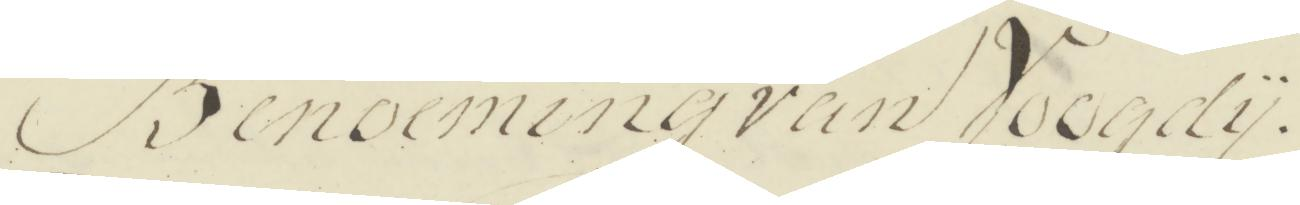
Benoeming van Voogdij.
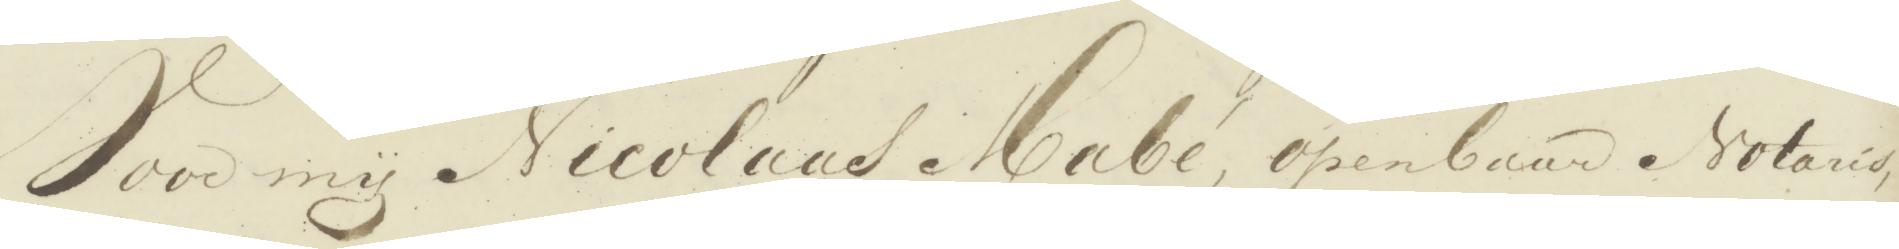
Voor mij Nicolaas Mabé, openbaar Notaris,
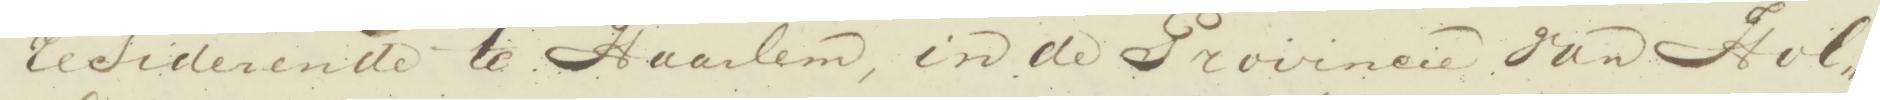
residerende te Haarlem, in de Provincie van Hol„
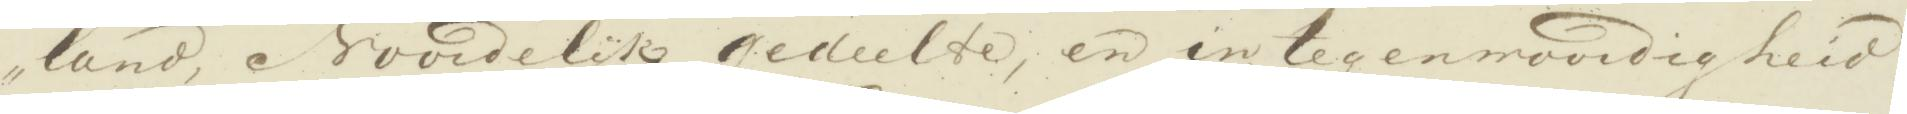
„land, Noordelijk gedeelte; en in tegenwoordigheid
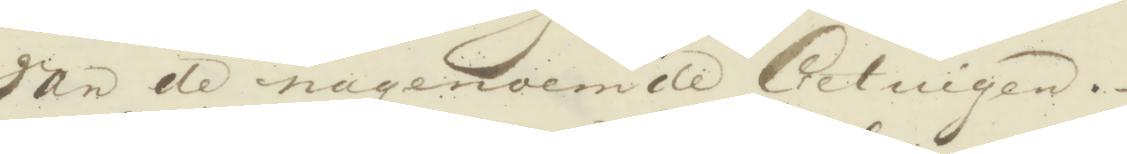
van de nagenoemde Getuigen.
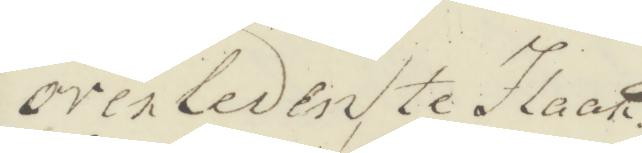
overleden te Haar
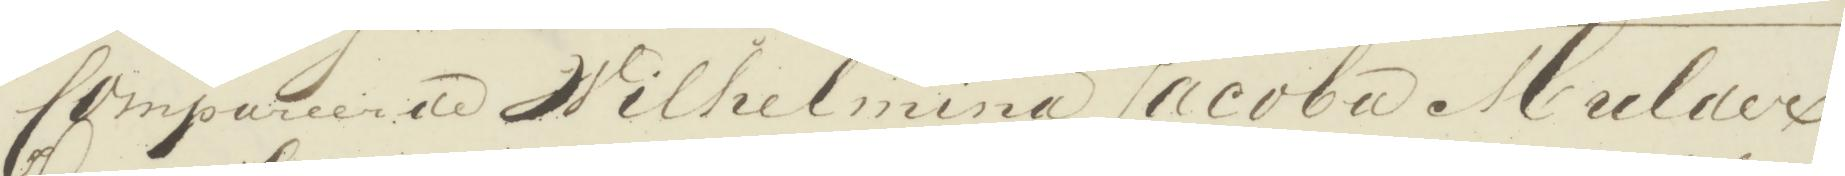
Compareerde Wilhelmina Jacoba Mulder,
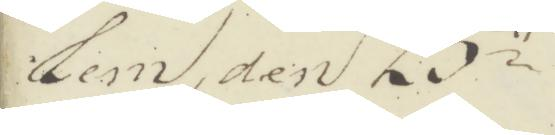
lem, den 23=en
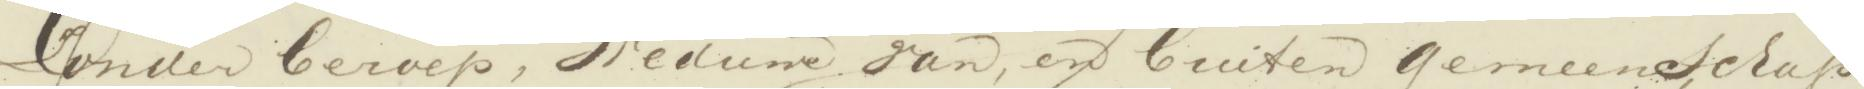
zonder beroep, weduwe van, en buiten gemeenschap
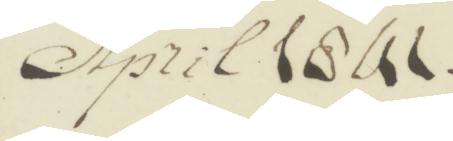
April 1841.
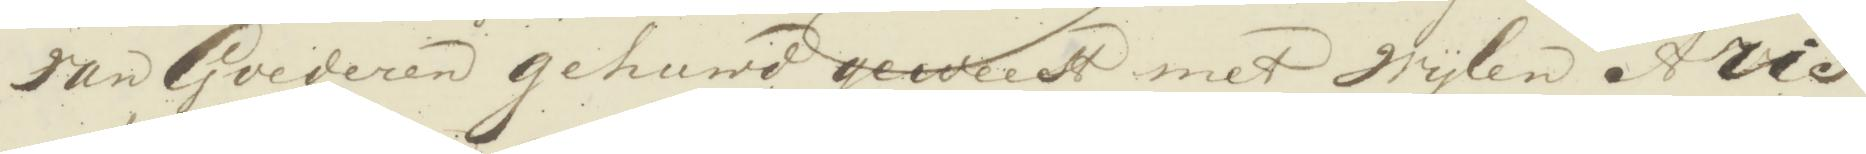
van Goederen gehuwd geweest met wijlen Arie
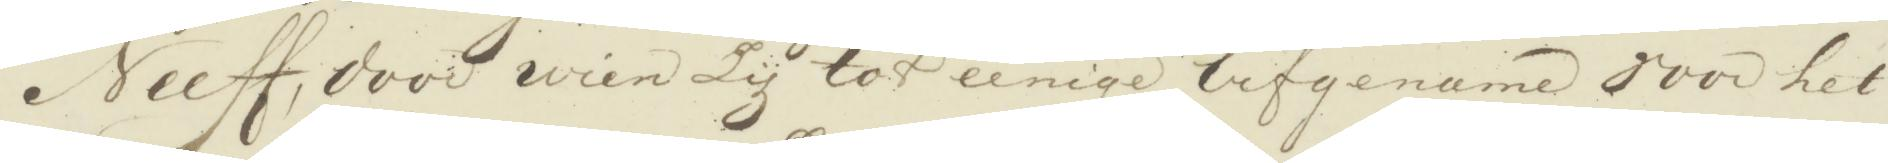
Neeff, door wien zij tot eenige Erfgename voor het
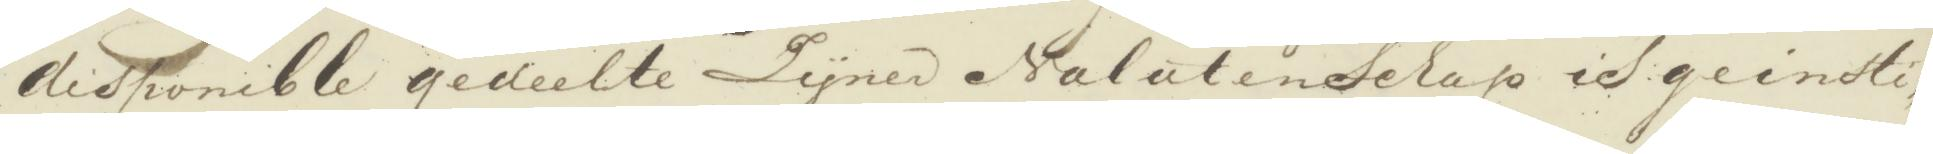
disponible gedeelte zijner Nalatenschap is: geinsti
